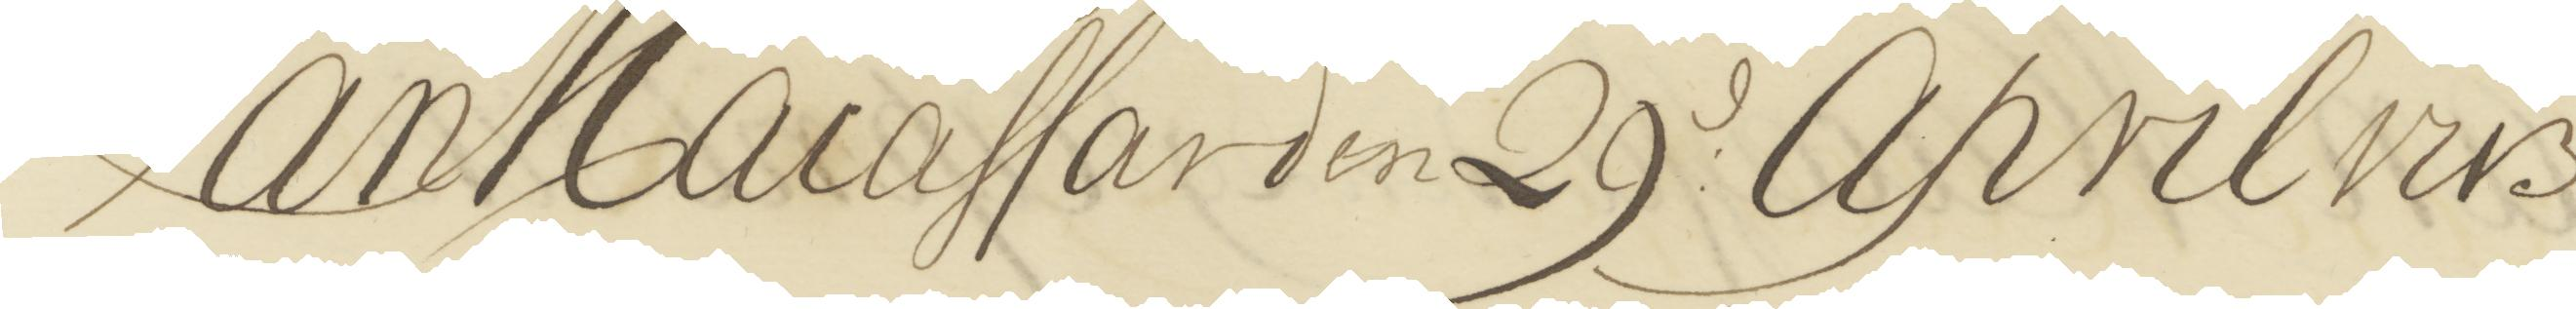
Van Macassar den 29:' April 1713
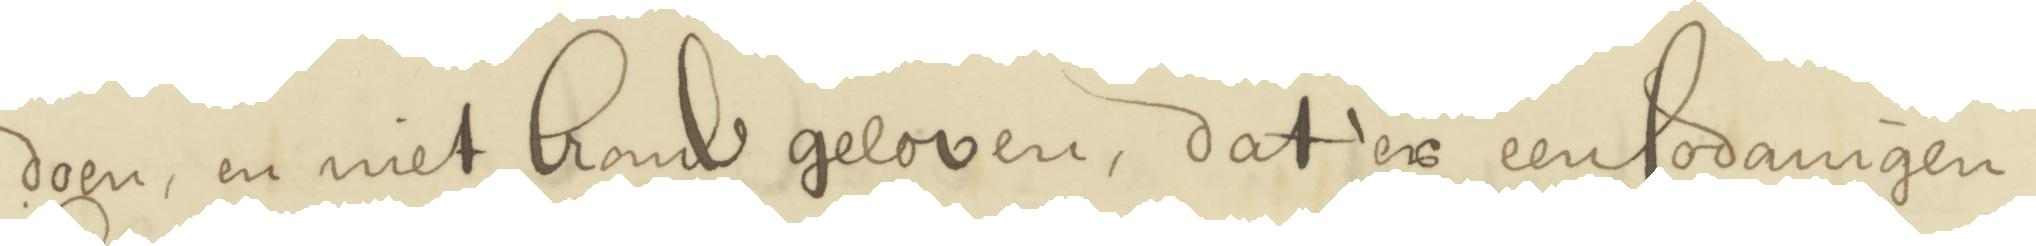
doen, en niet konde geloven, dat 'er een sodanigen
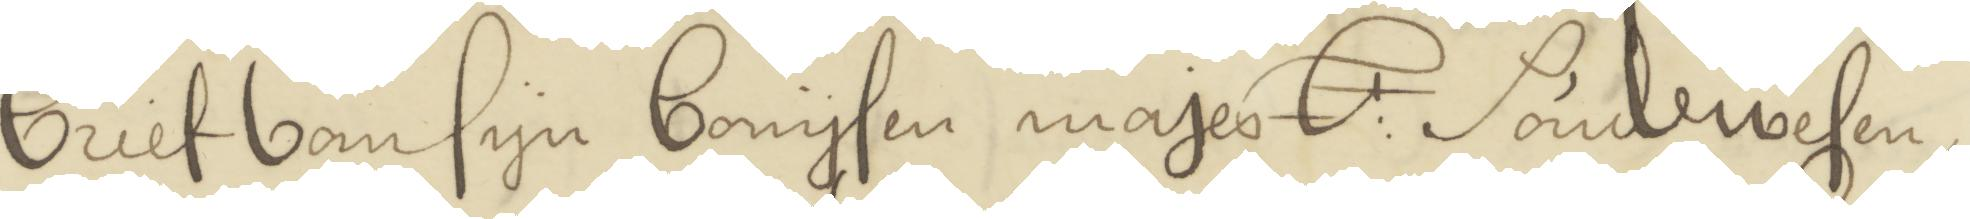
brief van sijn bonijsen majest:t soudewesen,
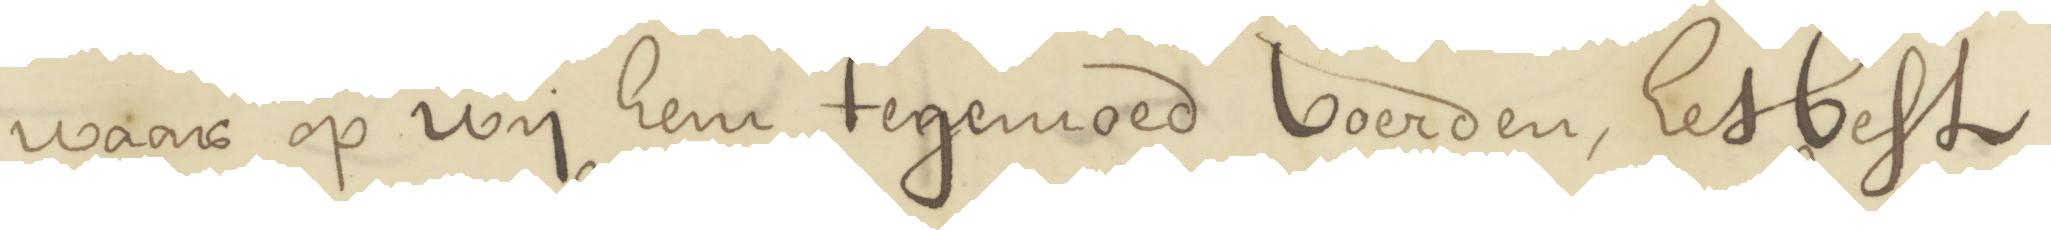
waar op wij hem tegemoed voerden, het beste
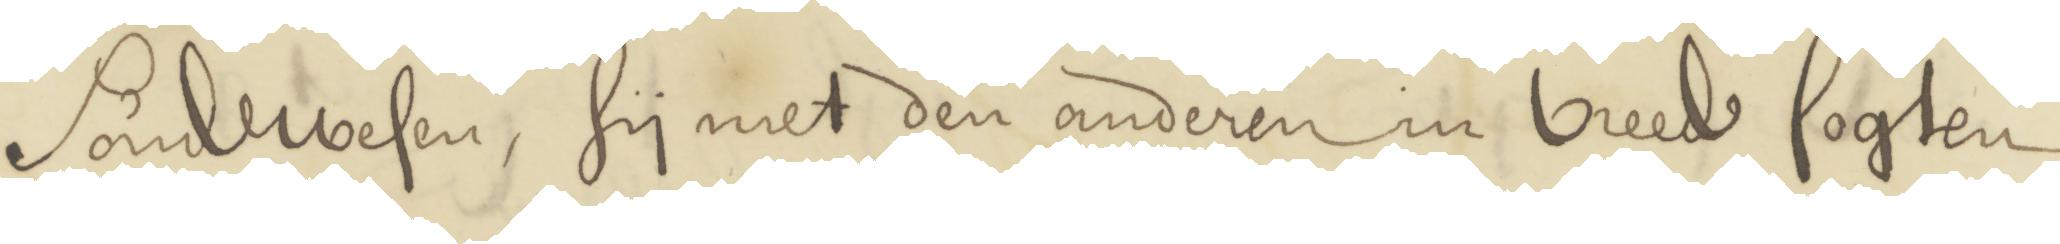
soudewesen, hij met den anderen in vreede sogten
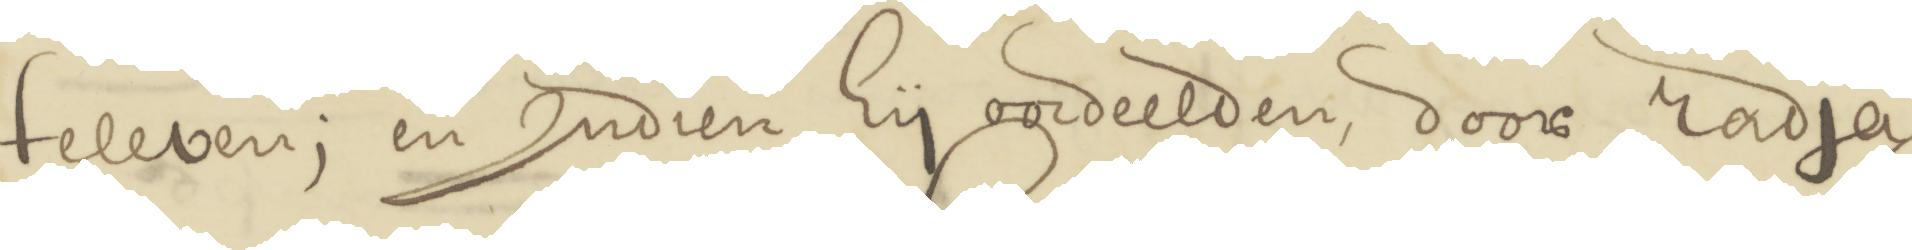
televen; en Jndien hij oordeelden, door radja
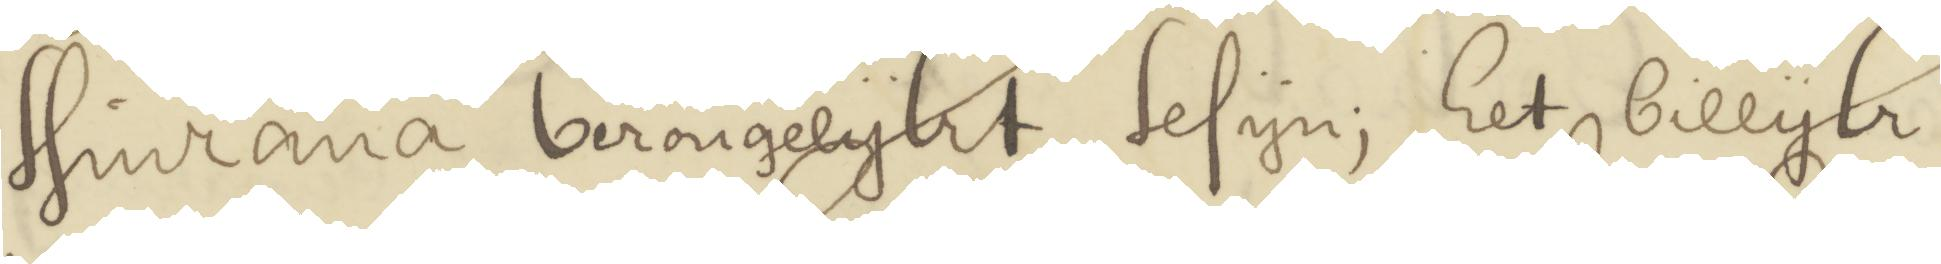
tsinrana verongelijkt tesijn; het billijk
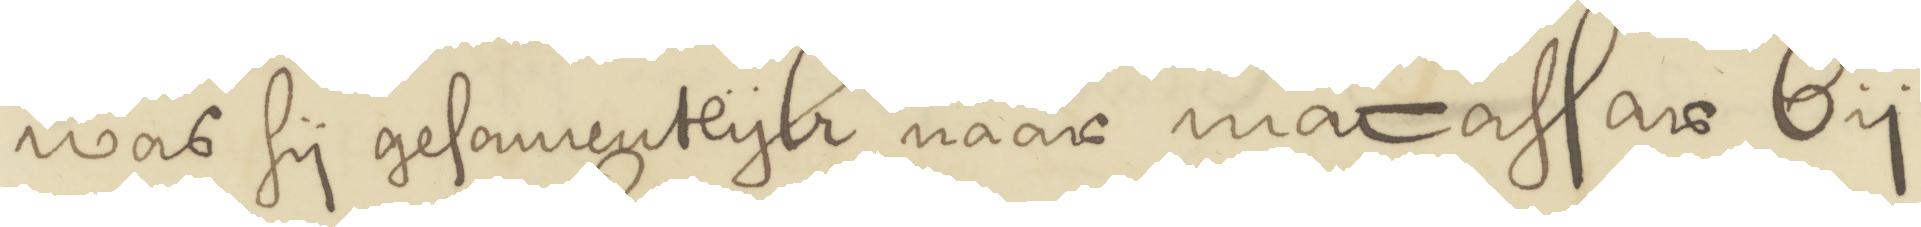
was sij gesamentlijk naar macassar bij
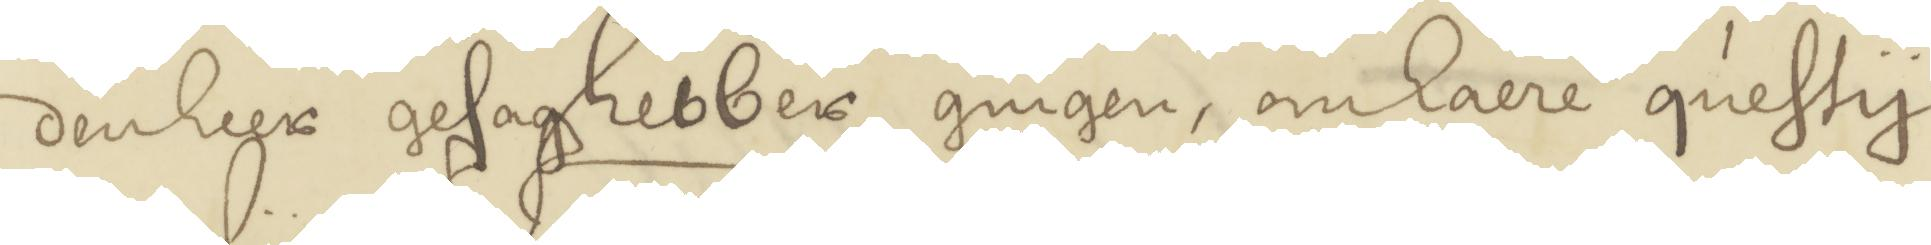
den heer gesaghebber gingen, om haere questij
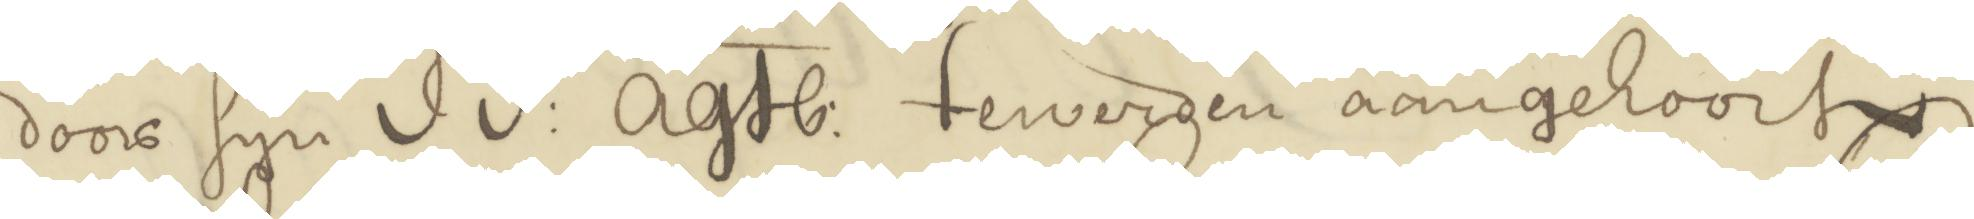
door sijn EE: agtb: tewerden aangehoort,
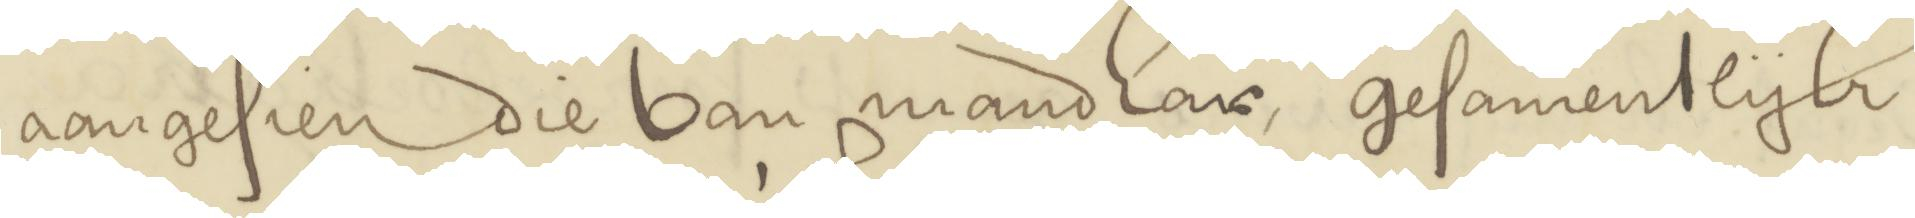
aangesien die van mandhar, gesamentlijk
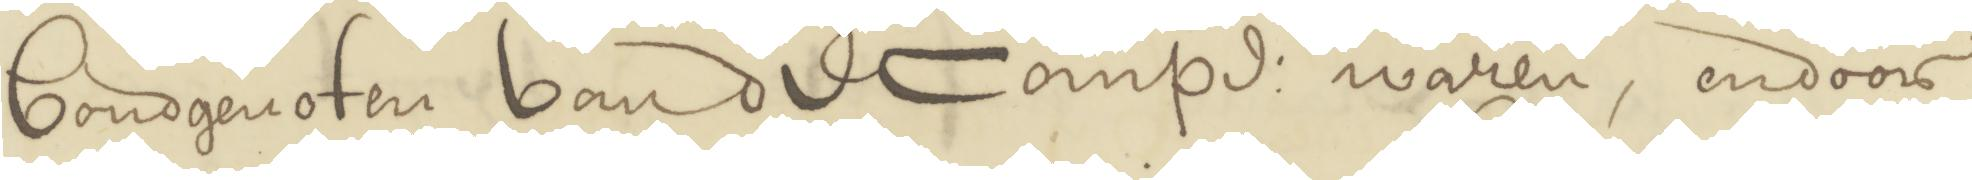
bondgenoten van d' ECompe: waren, en door
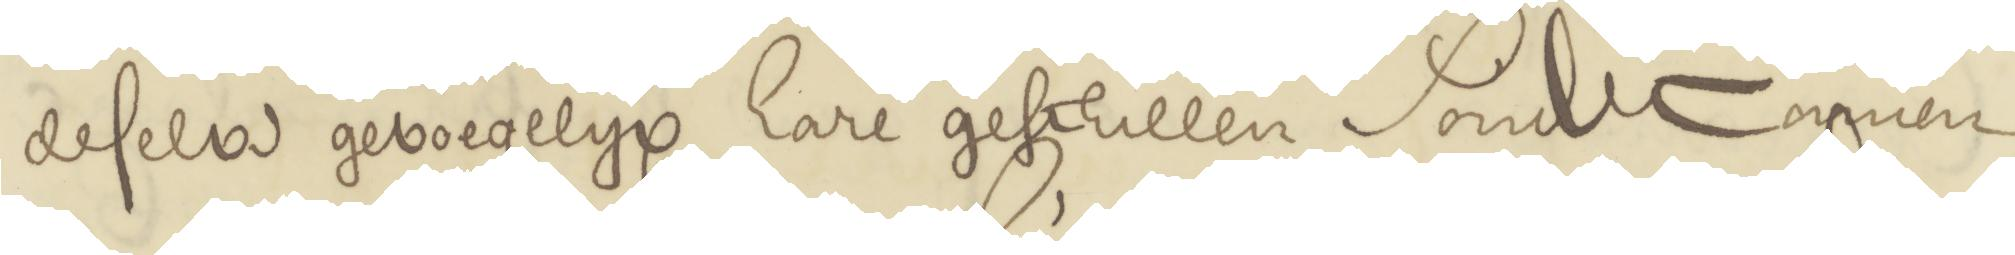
deselve gevoegelijx hare geschillen soude connen
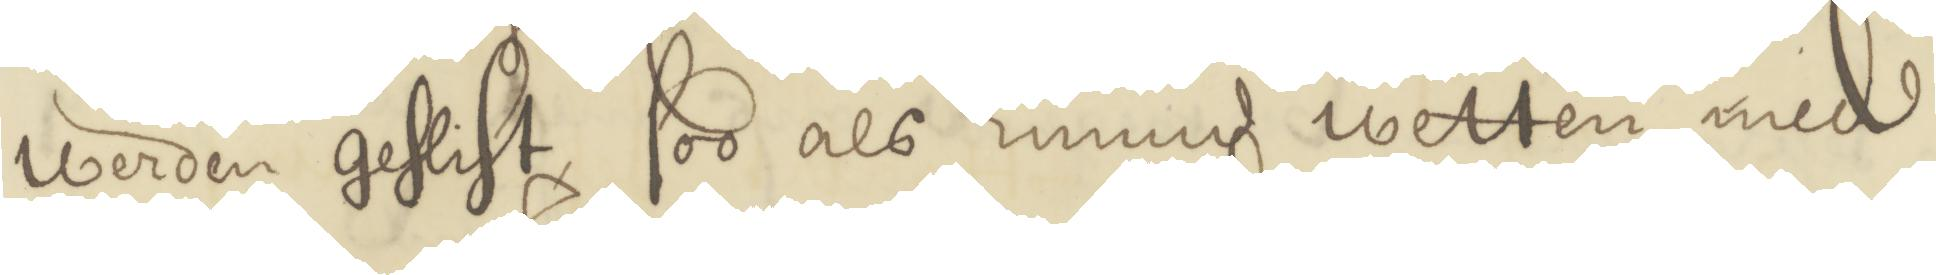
werden geslist, soo als hunne wetten mede
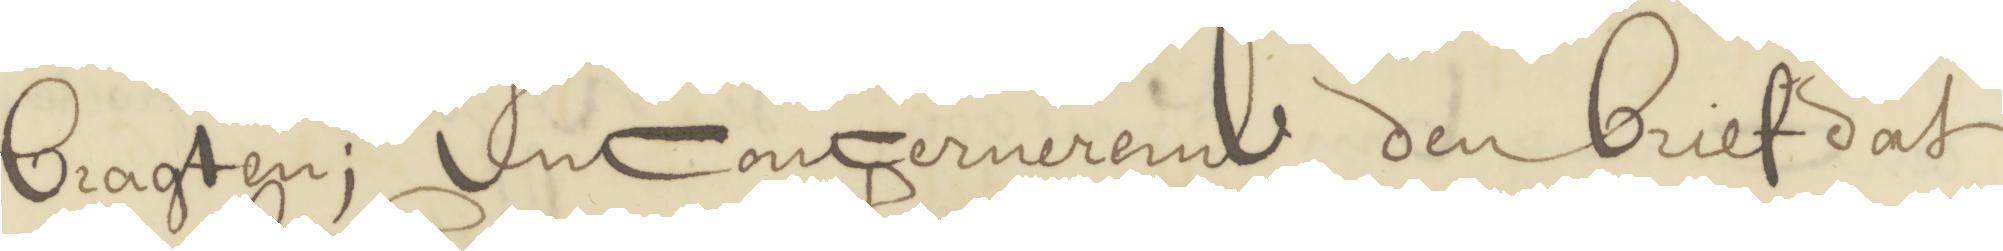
bragten; En concernerende den brief dat
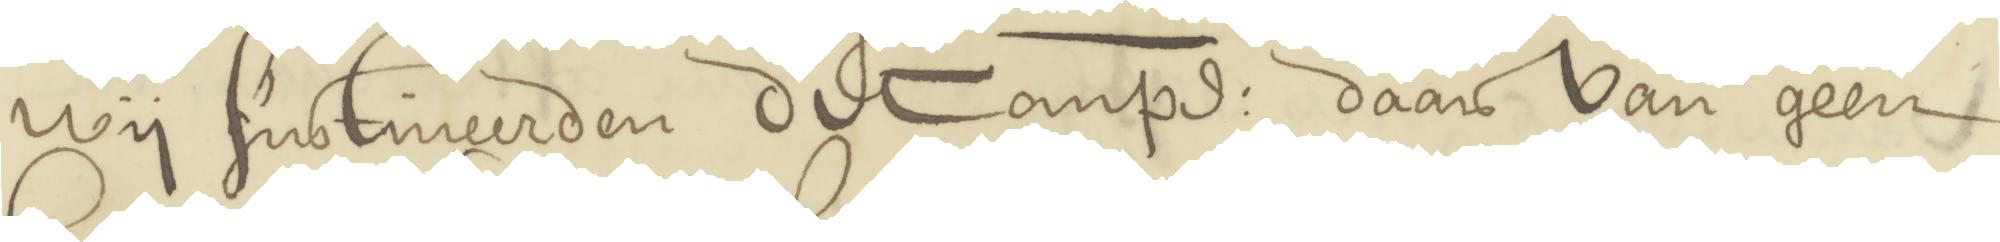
wij sustineerden d'ECompe: daar van geen
